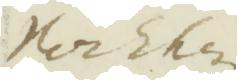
VerEken
